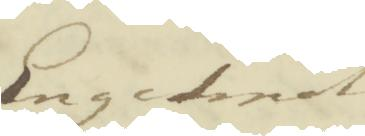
Engesmit
